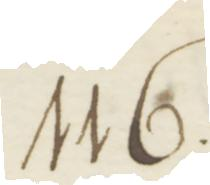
116.
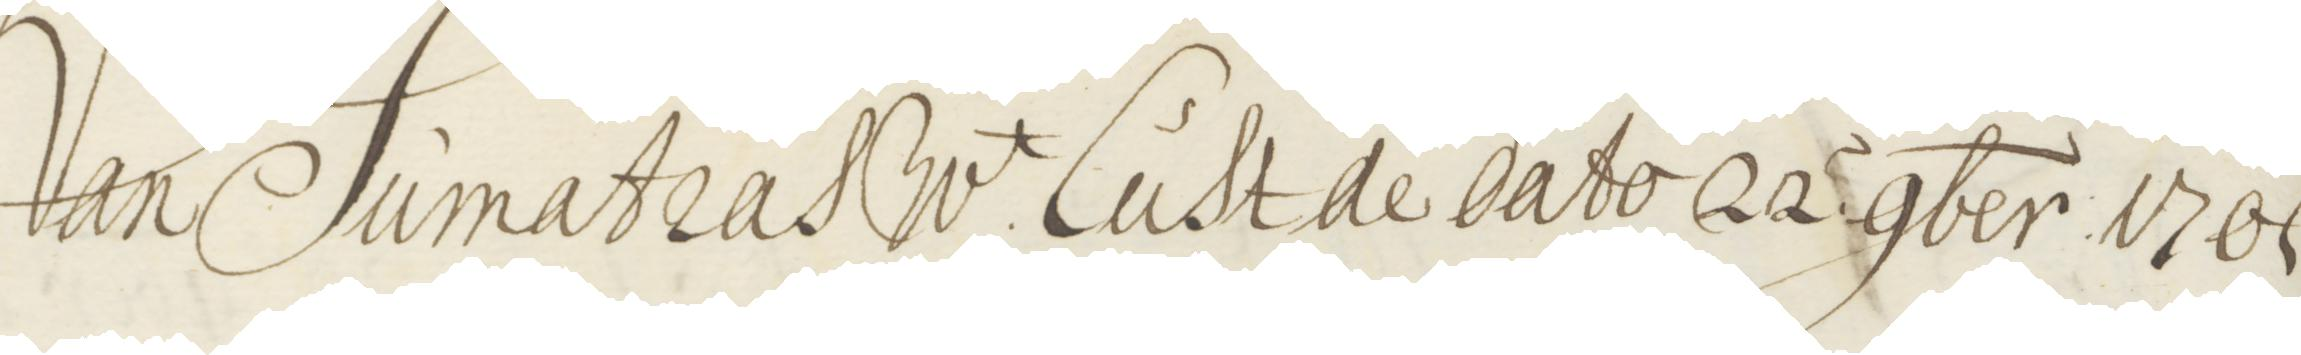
Van Sumatras W.t Cust de dato 22.' 9ber: 1705
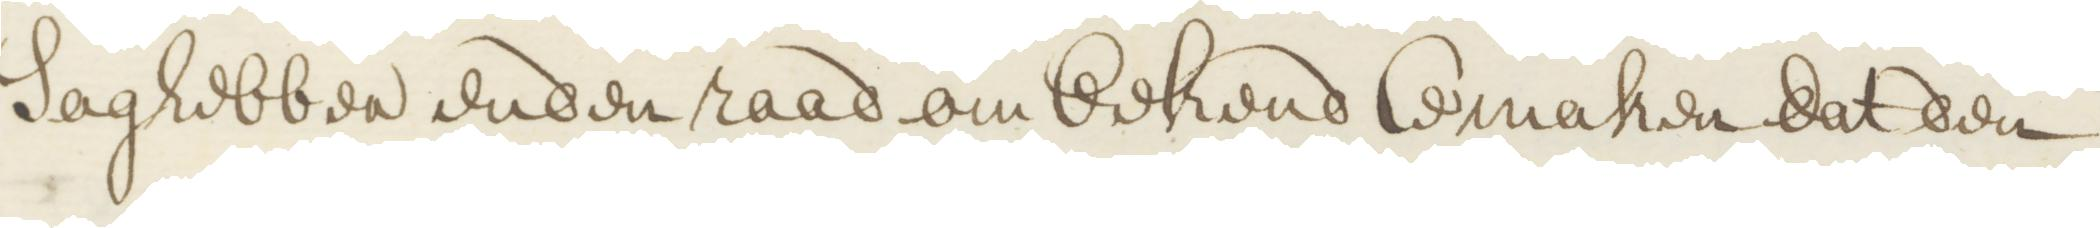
saghebber en den raad om bekend te maken dat den
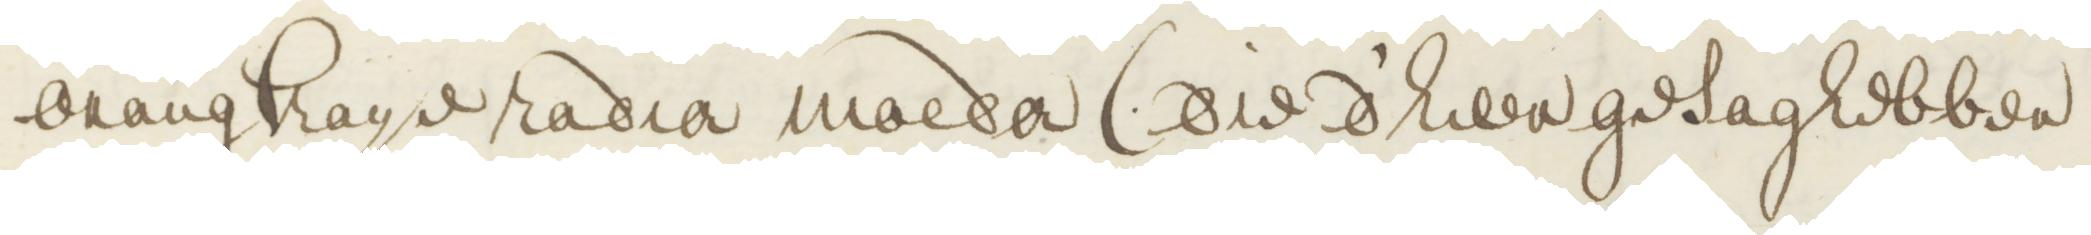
orangkaye radia moeda (die d’heer gesaghebber
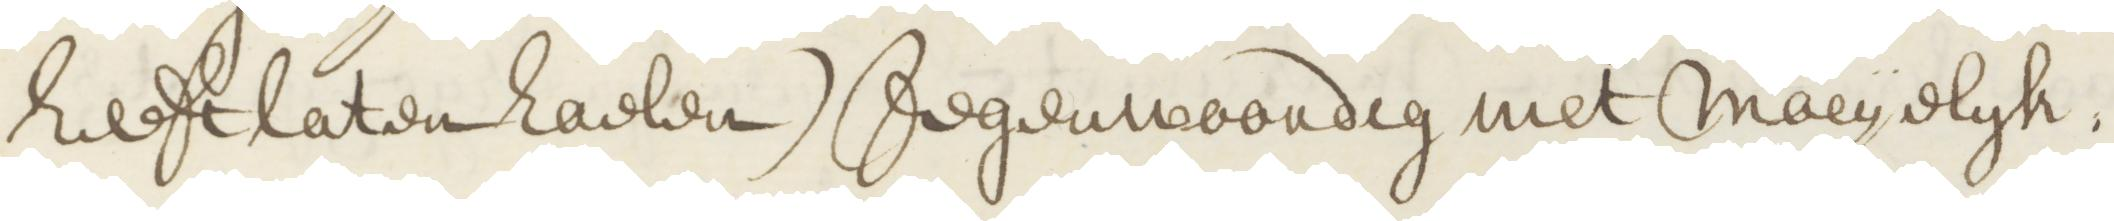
heeft laten haelen) jegenwoordig met moeijelyk„
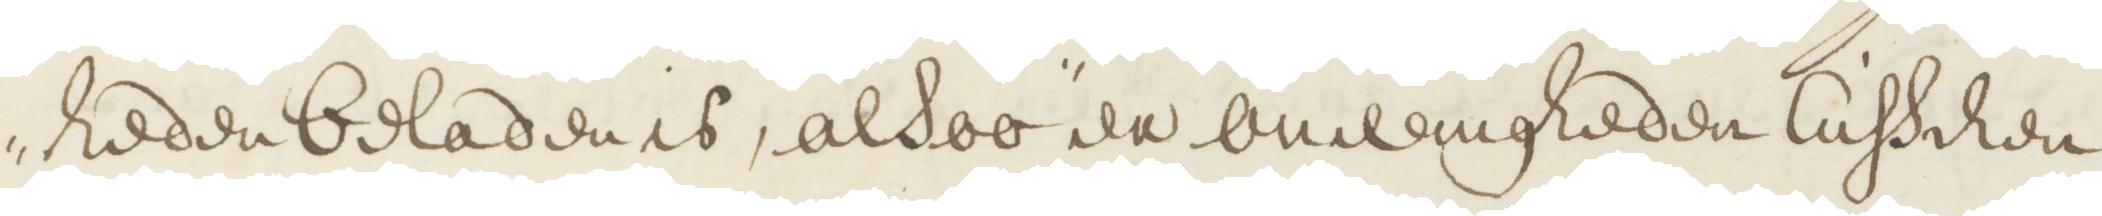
„heden beladen is, alsoo er oneenigheden tusschen
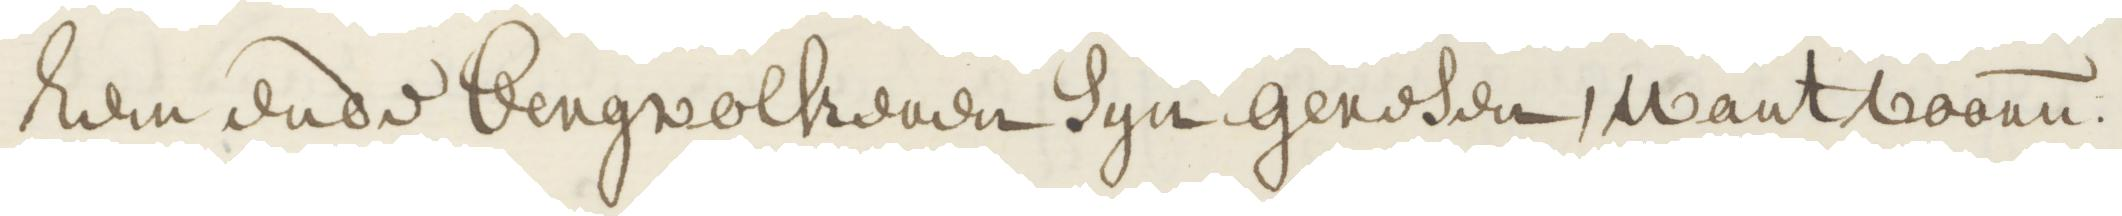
hem en de bergvolkeren sijn geresen, want voorn.
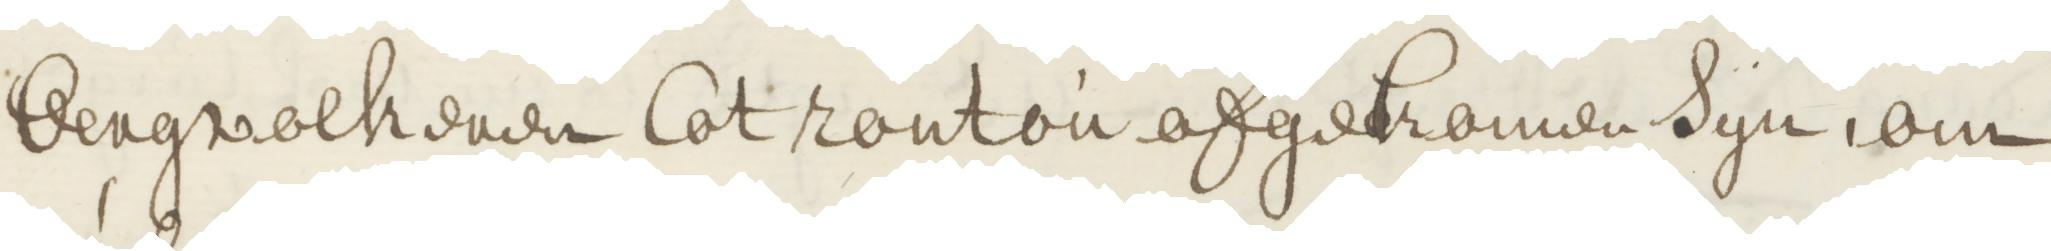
bergvolkeren tot rontou afgekomen sijn, om
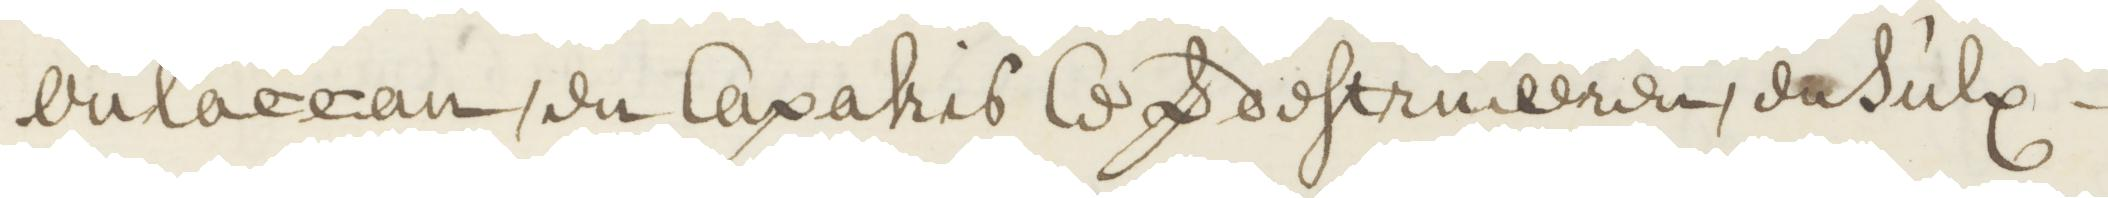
oulaccan, en tapakis te verdestrueeren, en sulx
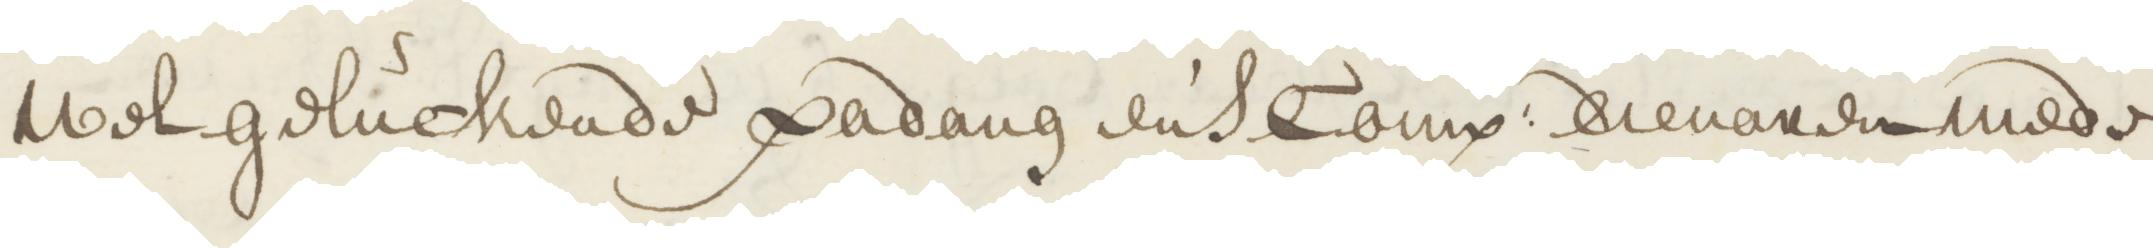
wel geluck en de padang en ’sComp:s dienaren mede
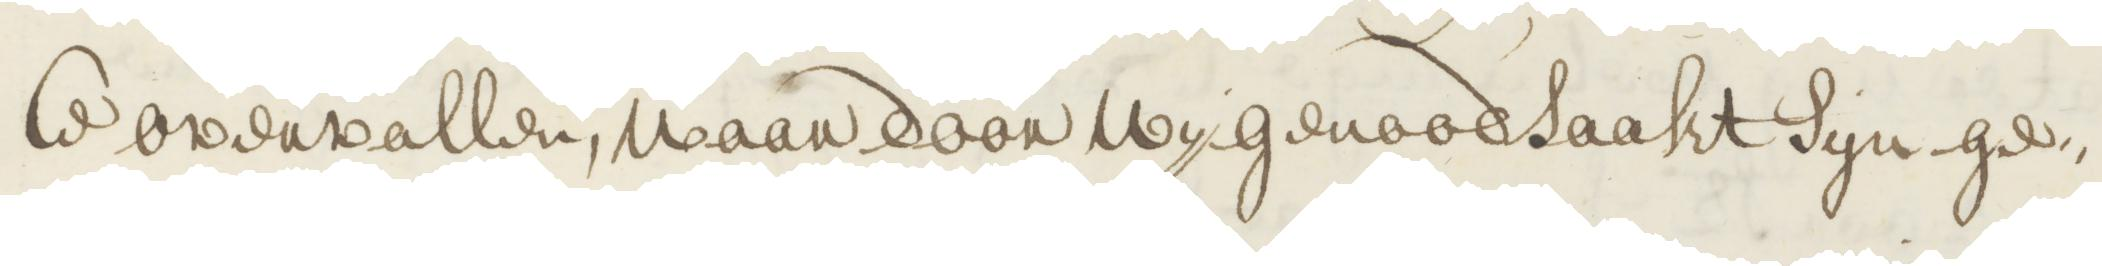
te overvallen, waar door wij genoodsaakt sijn ge„
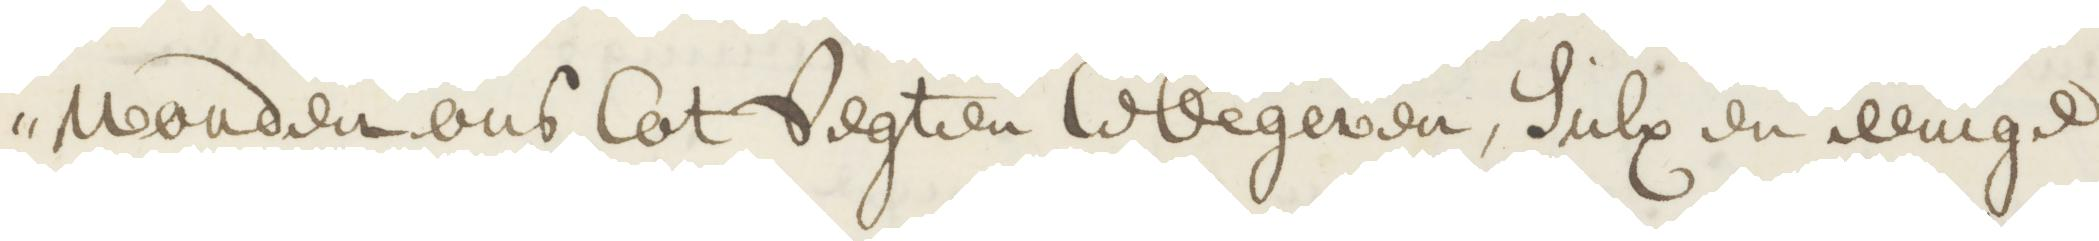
„worden ons tot vegten te begeven, sulx en eenige
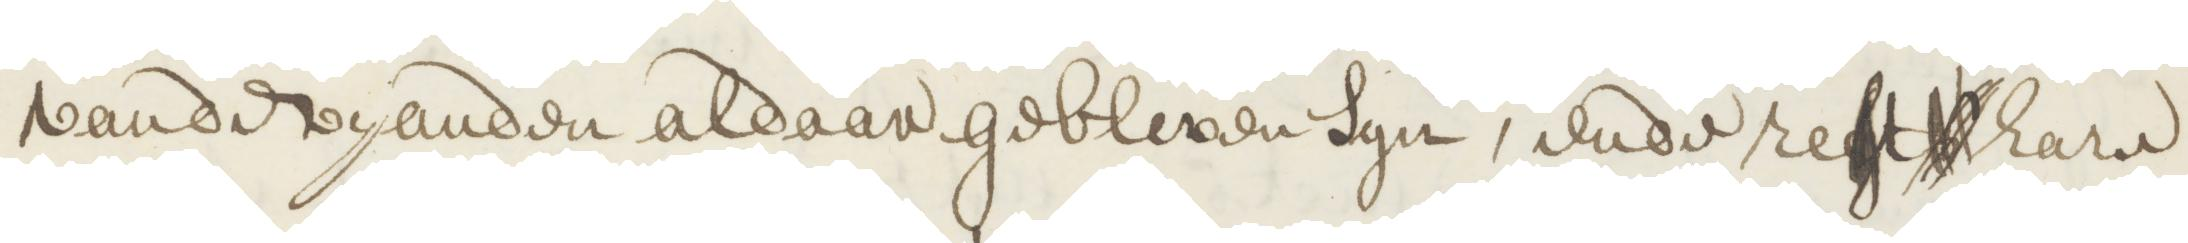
van de vijanden aldaar gebleven sijn, ende rest vhare
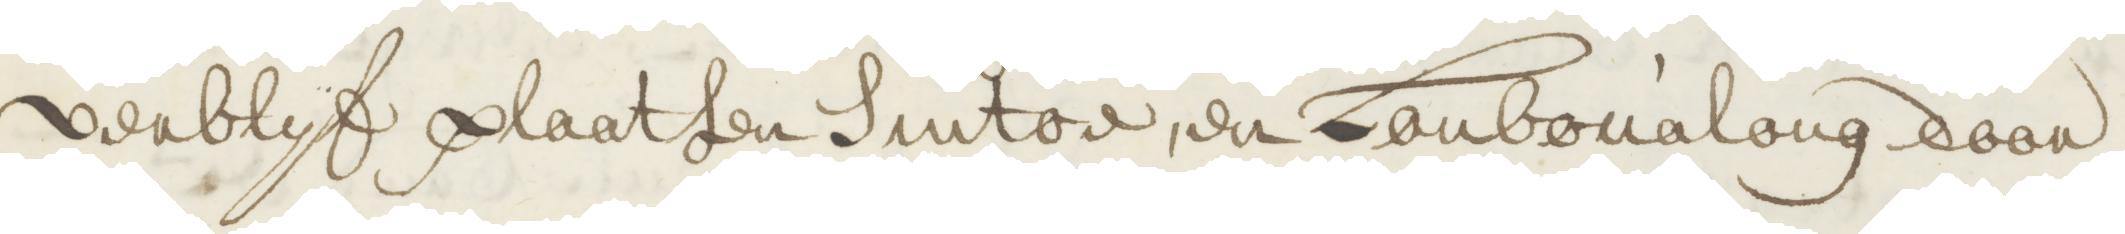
verblijf plaatsen sintoe, en Lonboualong door
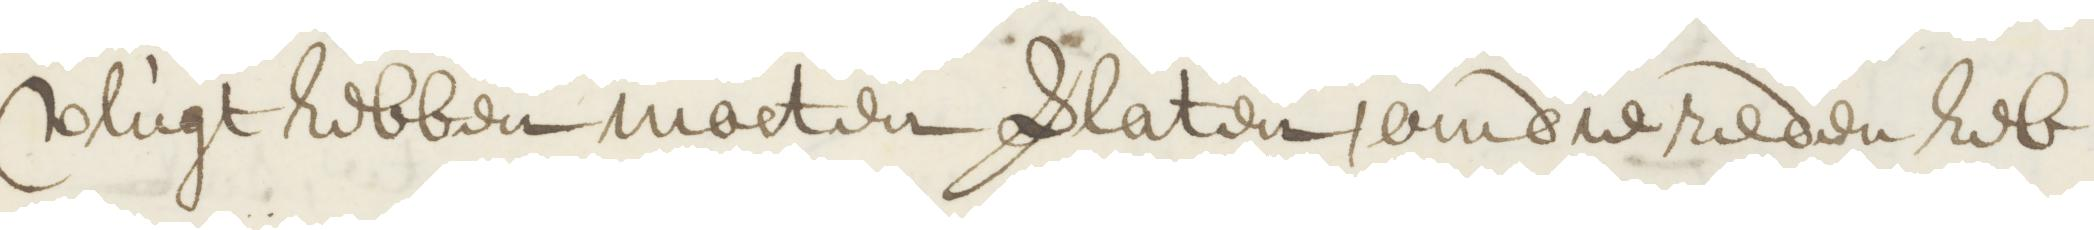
vlugt hebben moeten verlaten, om die heden heb
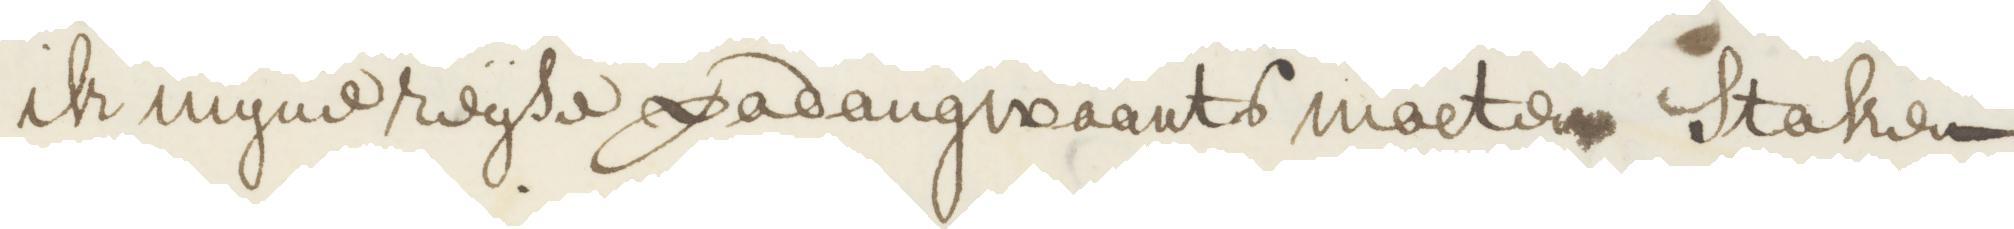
ik mijne reijse padangwaarts moete staken
